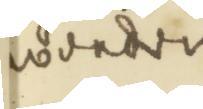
werde
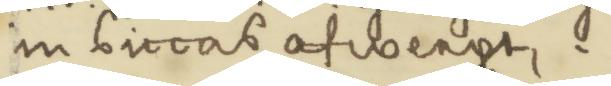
in siccas afwerpt, .
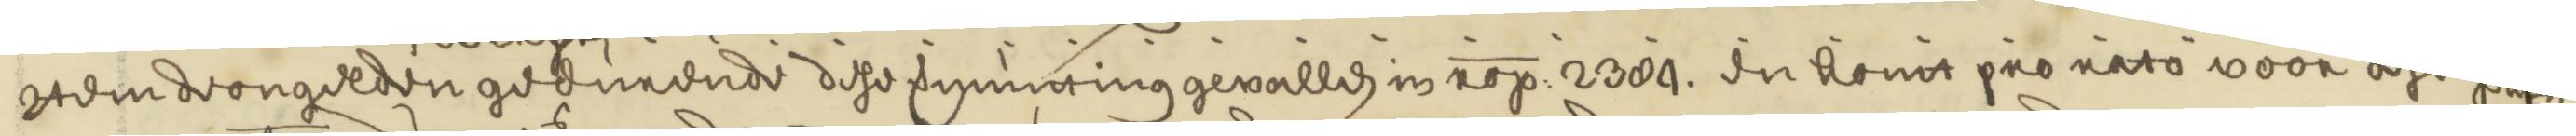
jtem de ongelden gedurende dese vermunting gevallen in rop: 2384. en komt pro rato voor dese patij
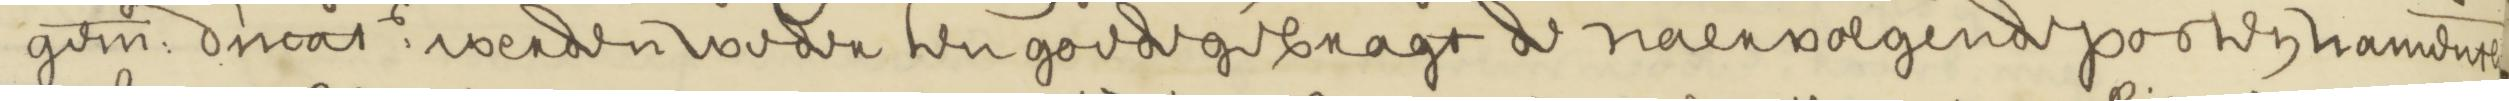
gem: ducat:s werden weder ten goede gebragt de naervolgende posten namentlijk
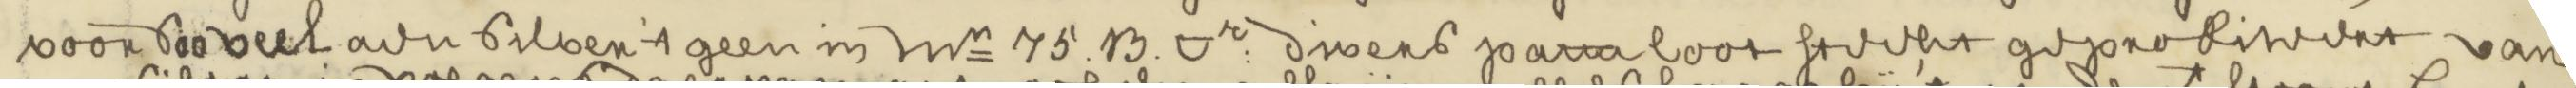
voor sooveel aen silver ’t geen in m=r 75. 13. c:r divers pacca loot steekt geprofiteert van
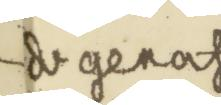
de gera
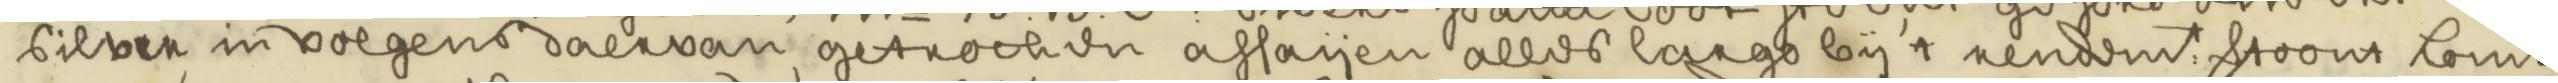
silver in volgens daervan getrocken assaijen alles largo bij ’t rendem:t vertoont komt
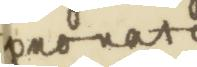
prorat
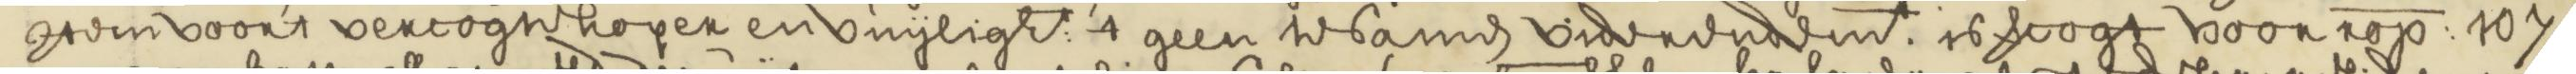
jtem voor’t vercogte koper en vuijligh:t ’t geen tesamen viderendem.t is vercogt voor rop: 107.
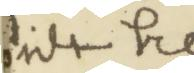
iet k
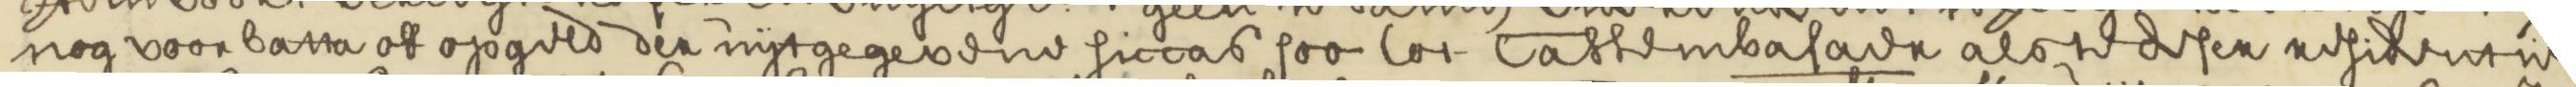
nog voor batta of opgeld der uijtgegevene siccas soo tot Cassembasaer als te deser residentie
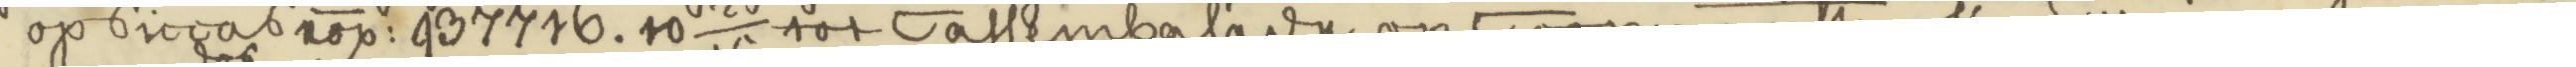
op siccas rop: 437716. 10 2/15 tot Cassembasaer op Coopmansz: &: uijtgegeven a 3 p=r
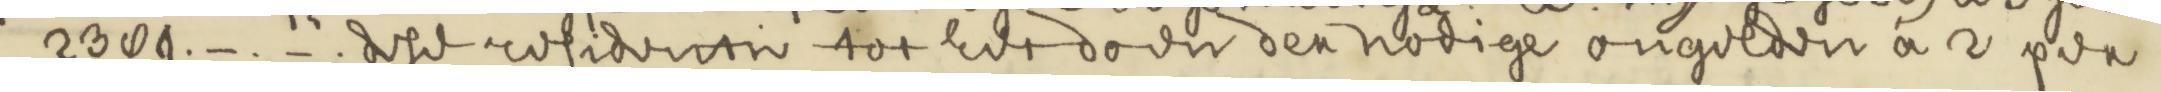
2384. – . – . dese residentie tot het doen der nodige ongelden â 2 per
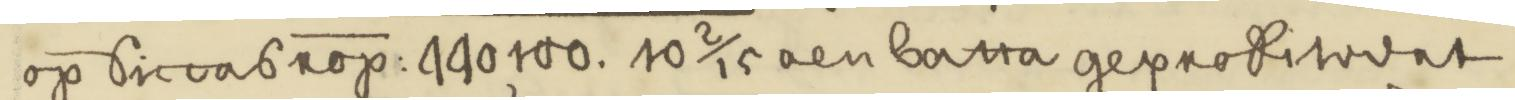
op siccas rop: 440100. 10 2/15 aen batta geprofiteert
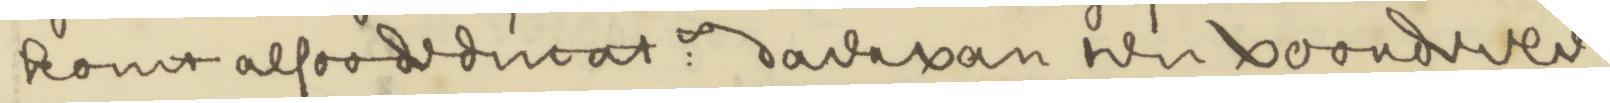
komt alsoo de ducat:s daervan ten voordeele
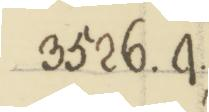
3526. 4.
